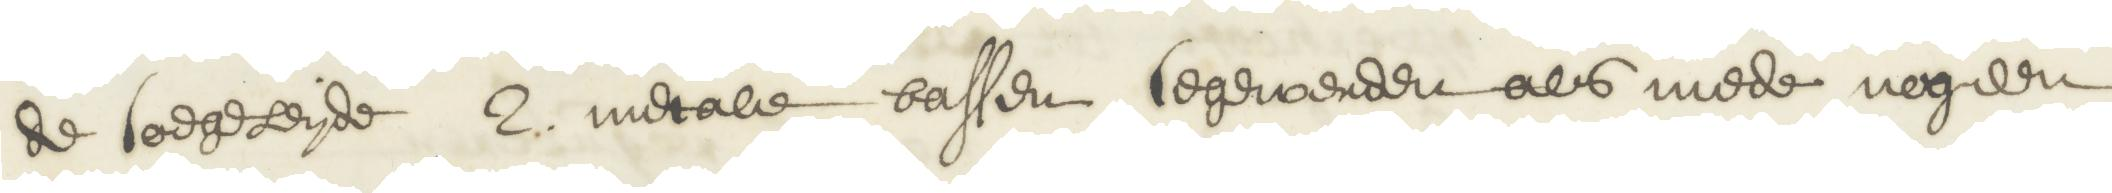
de toegeseijde 2. metale bassen tegewerden als mede nog een
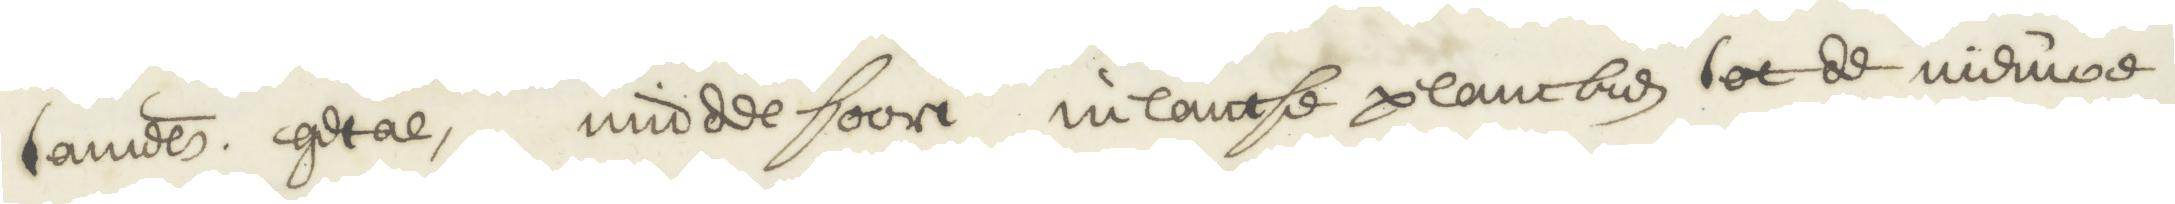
samelijk getal, middelsoort inlantse plancken tot de nieuwe
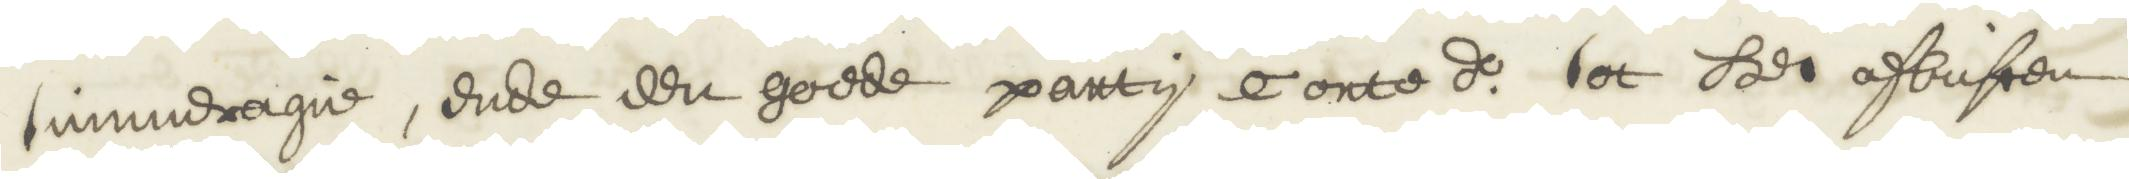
timmeragie, ende een goede partij corte d.o tot het afbusten
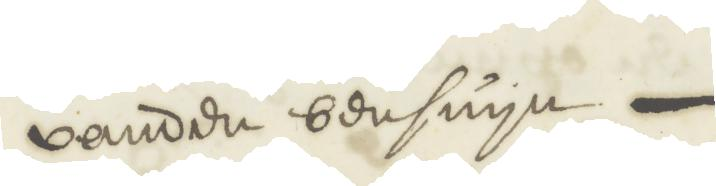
vanden bensuijn
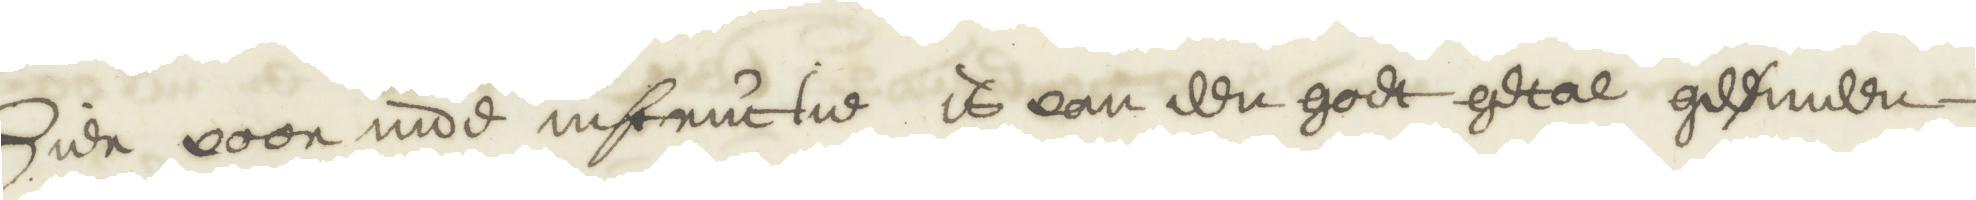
hier voor inde instructie is van een goet getal geemeen
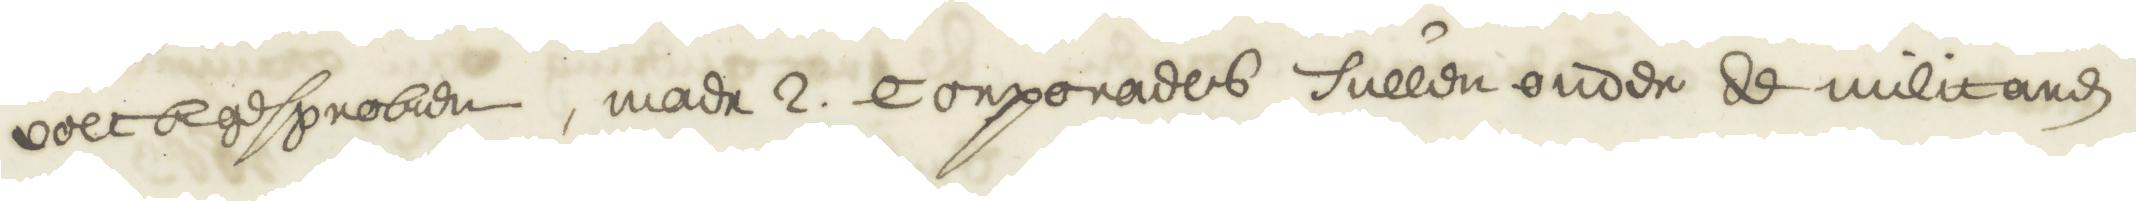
volck gesproken, maer 2. corporaels sullen onder de militaren
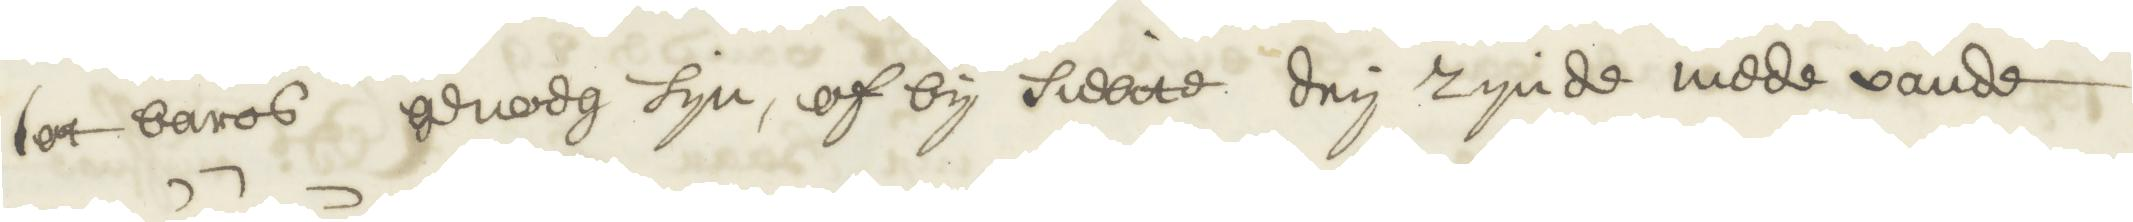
tot baros genoeg sijn, of bij swecte drij zijnde mede vande
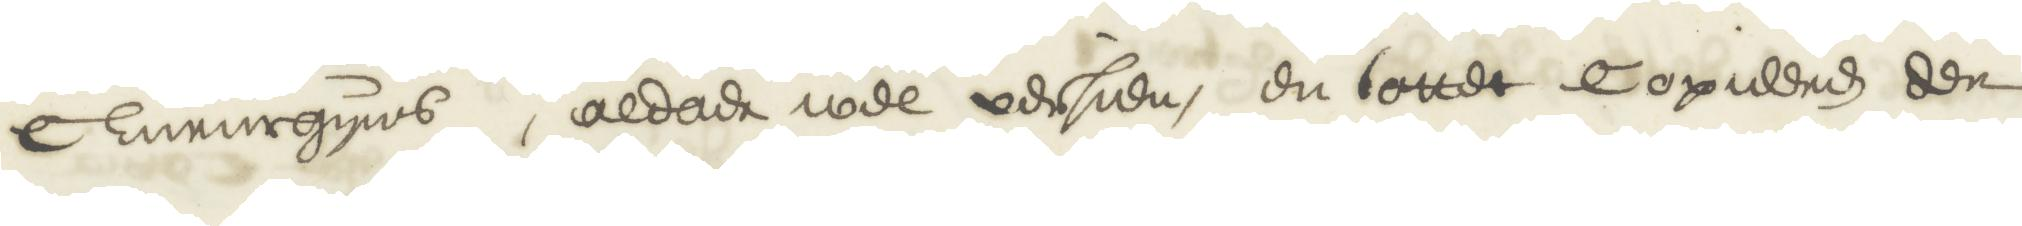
Chururgijns, aldaer wel versien, en tottet copieeren der
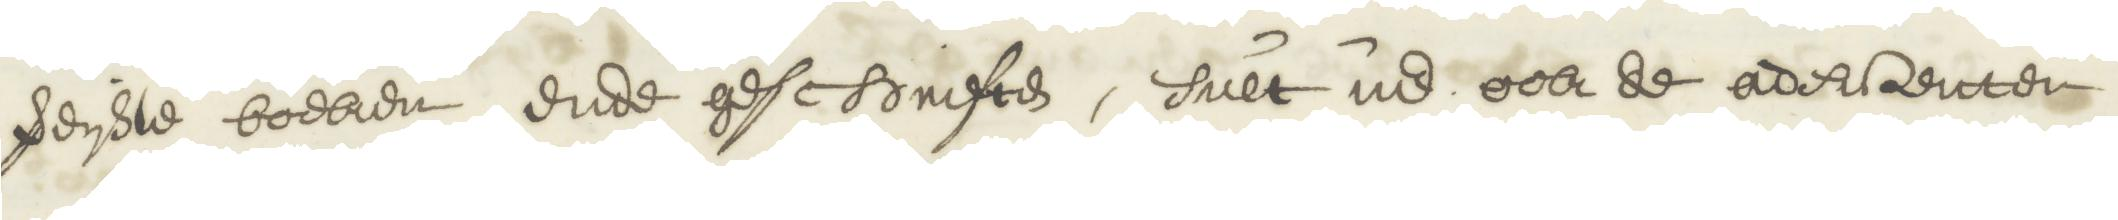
vereijste boeken ende geschriften, sult uE ook de adsisenten
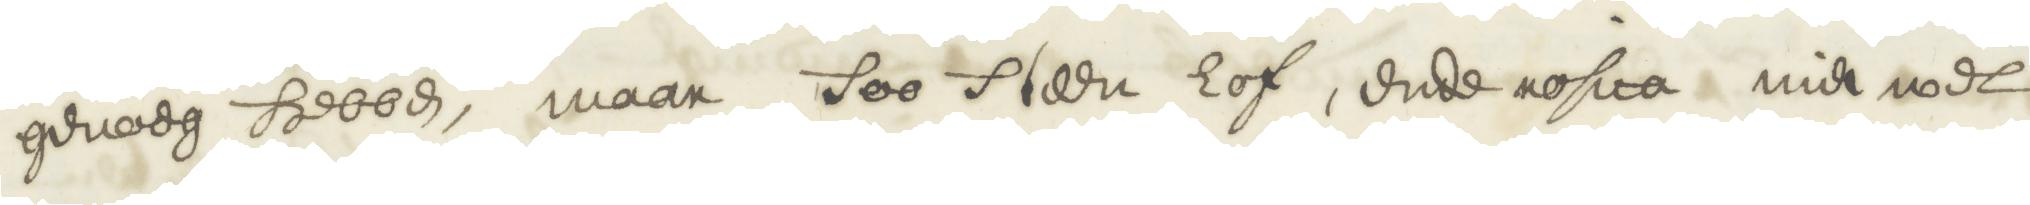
genoeg hebben, maar soo steen hof, ende rosica niet wel
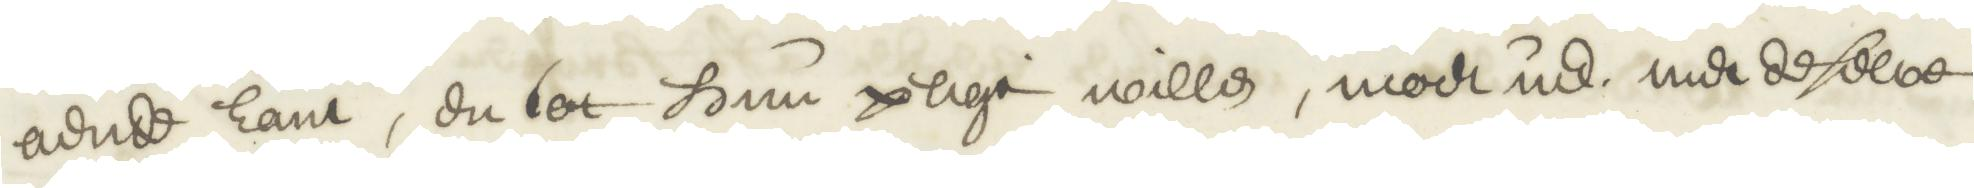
aende hant, en tot hun pligt willen, moet uE. met deselve
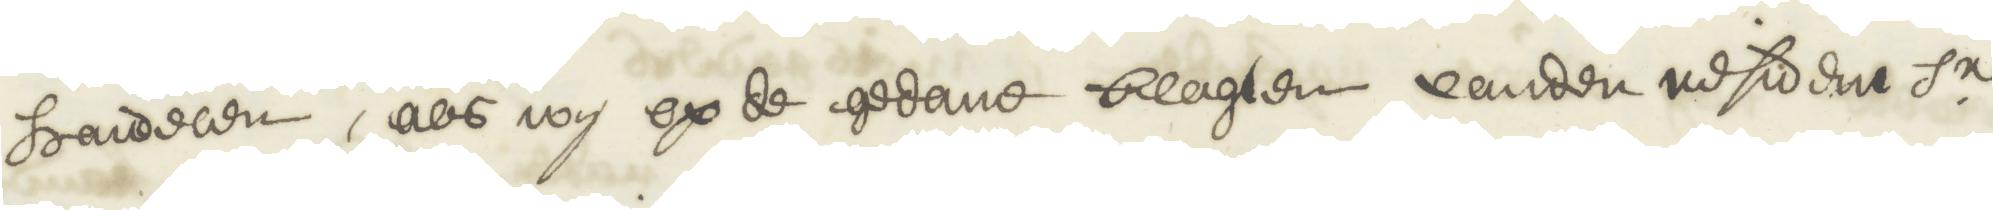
handelen, als wy op de gedane klagten vanden resident S,r
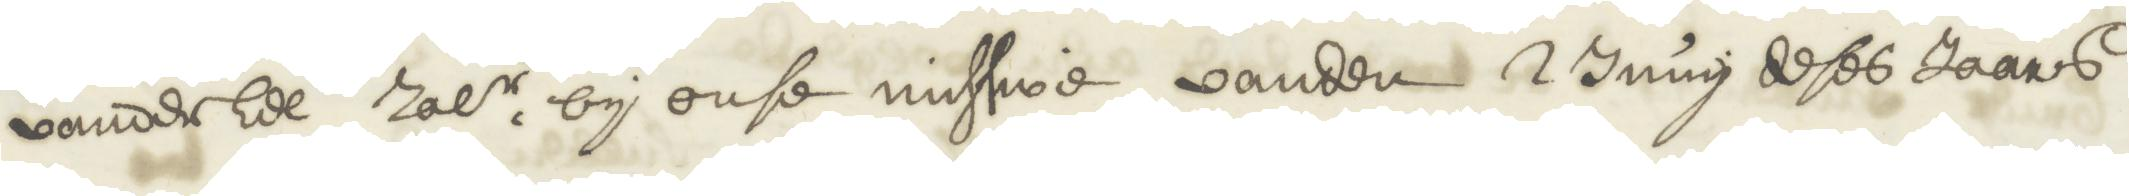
vander hel zal'r bij onse missive vanden 2 Junij deses Iaars
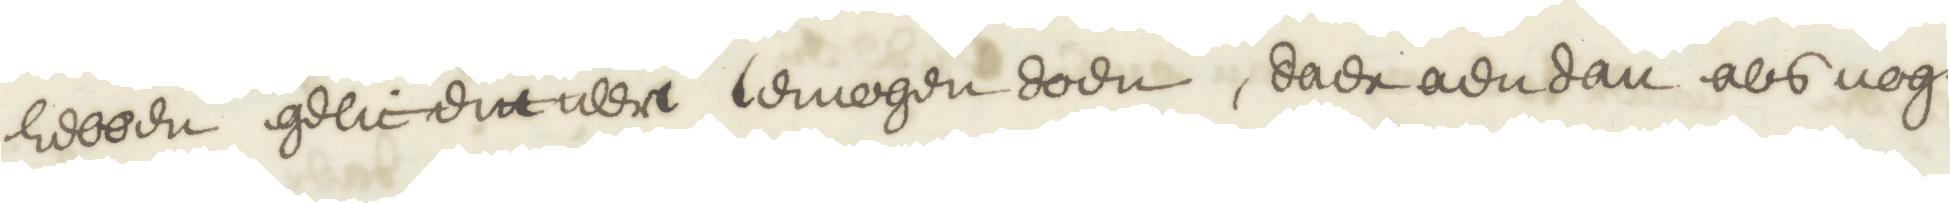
hebben gelicentieert temogen doen, daer aen dan als nog
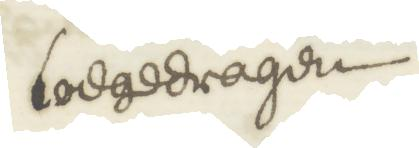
toegedragen
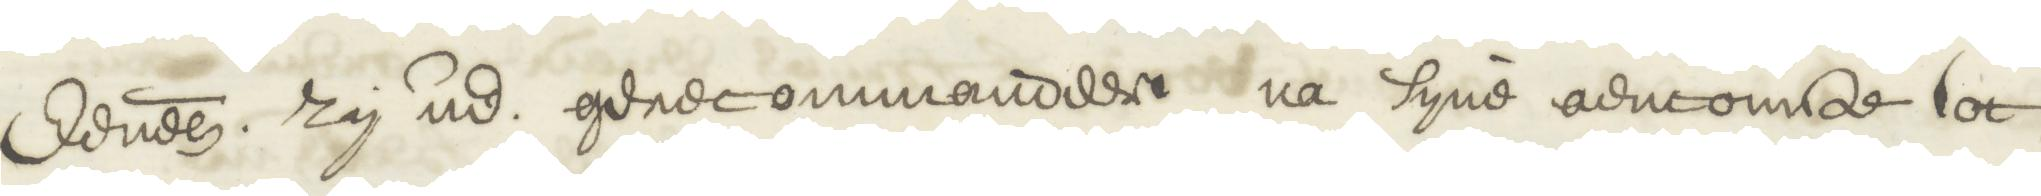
Eenelijk zij uE. gerecommandeert na sijne aencomste tot
